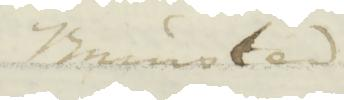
Munster
